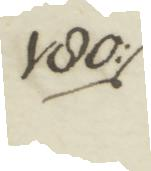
180:
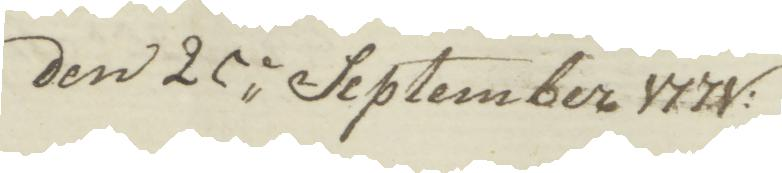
den 25„e September 1771:
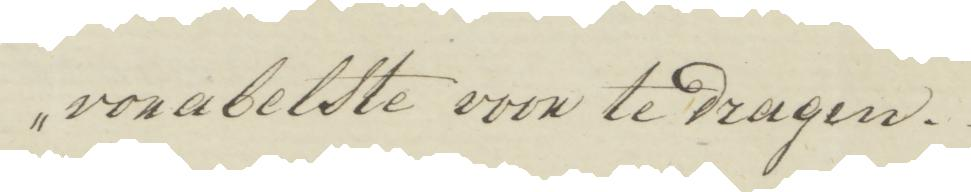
„vorabelste voor te dragen.
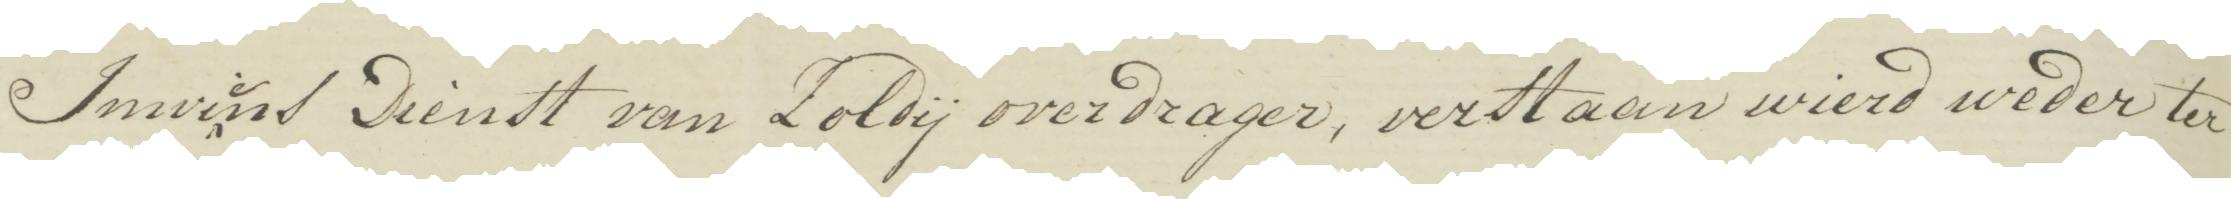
Inwiens Dienst van zoldij overdrager, verstaan wierd weder ter
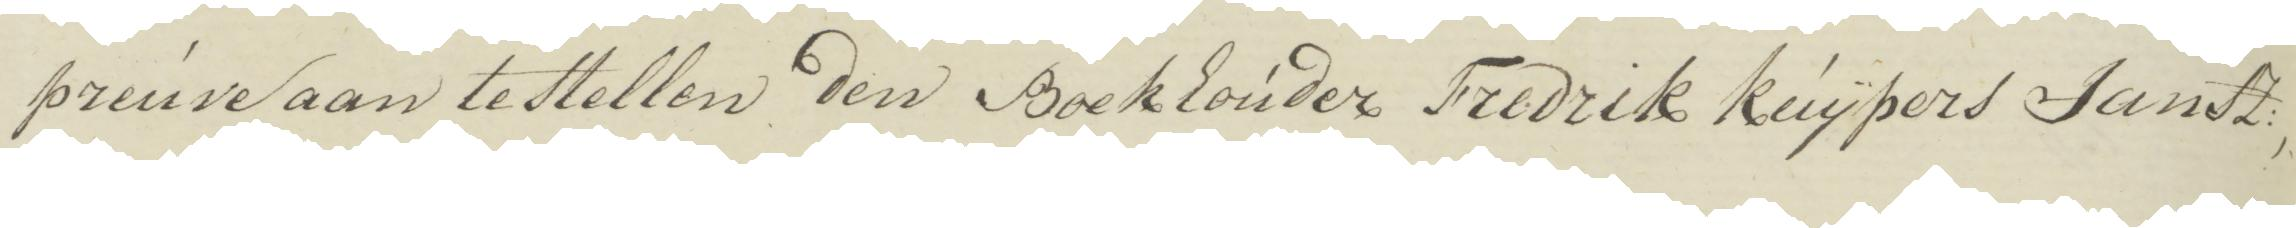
preuve aan te stellen den Boekhouder Fredrik Kuijpers Iansz:
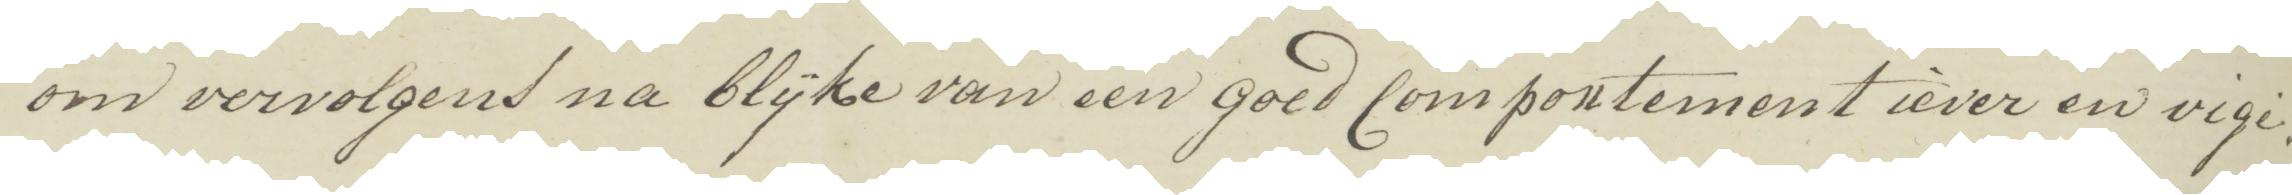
om vervolgens na blijke van een goed Comportement iever en vigi
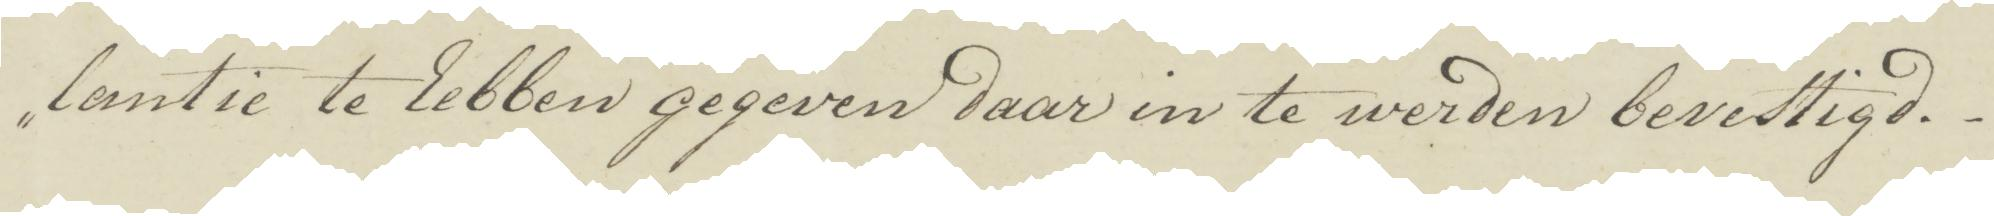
„lantie te hebben gegeven daar in te werden bevestigd.
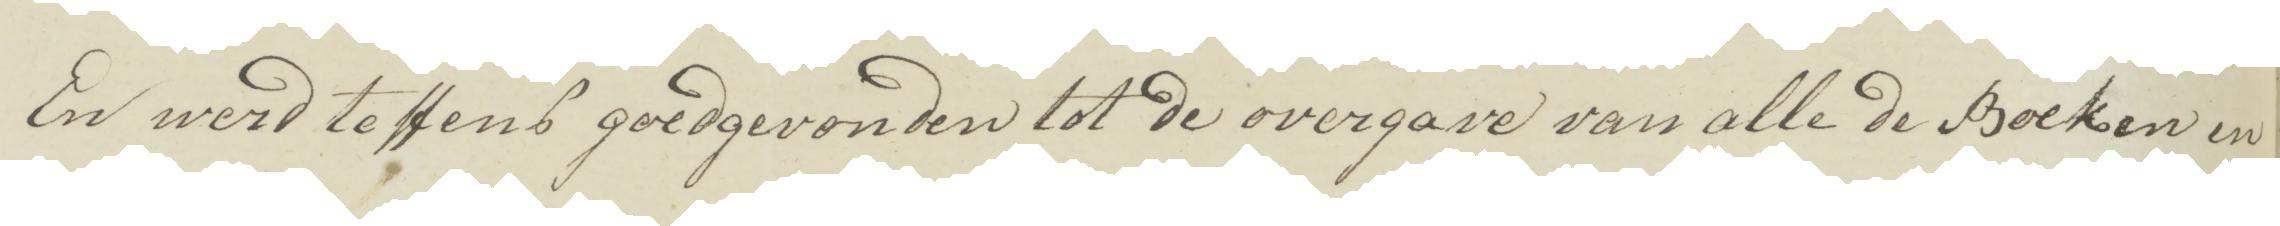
En werd teffens goedgevonden tot de overgave van alle de Boeken en
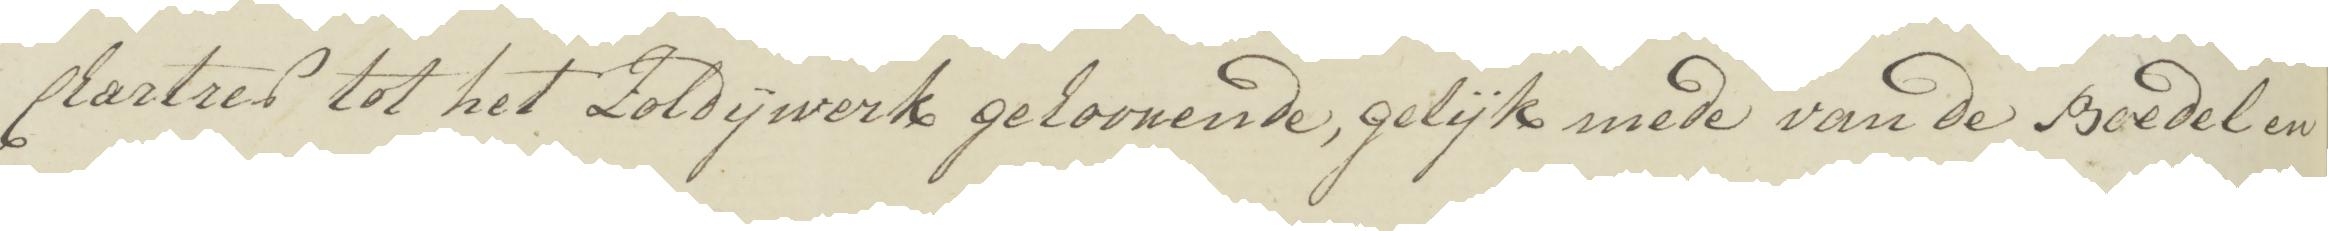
Chartres tot het zoldijwerk gehoorende, gelijk mede van de Boedel en
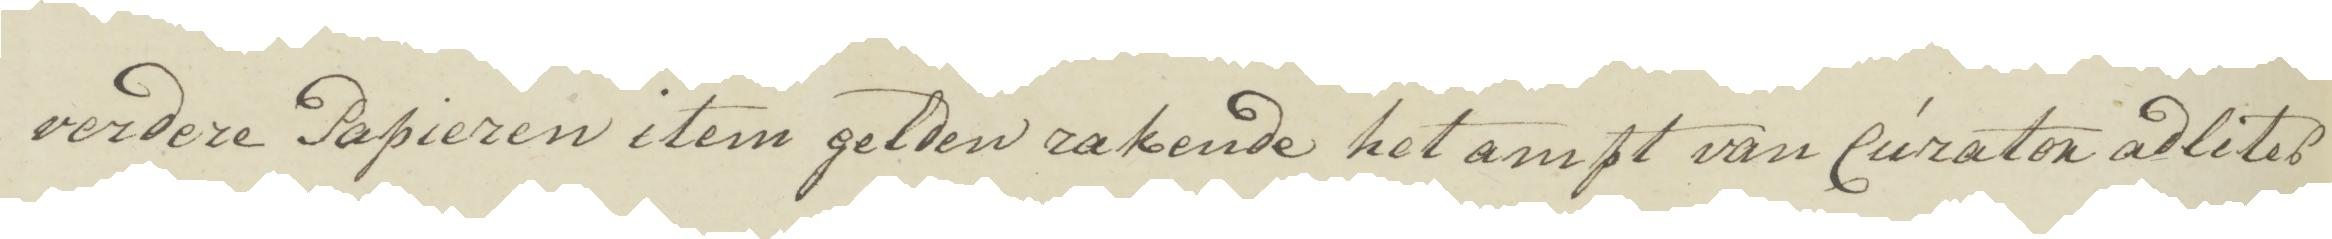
verdere Papieren item gelden rakende het ampt van Curator adlites
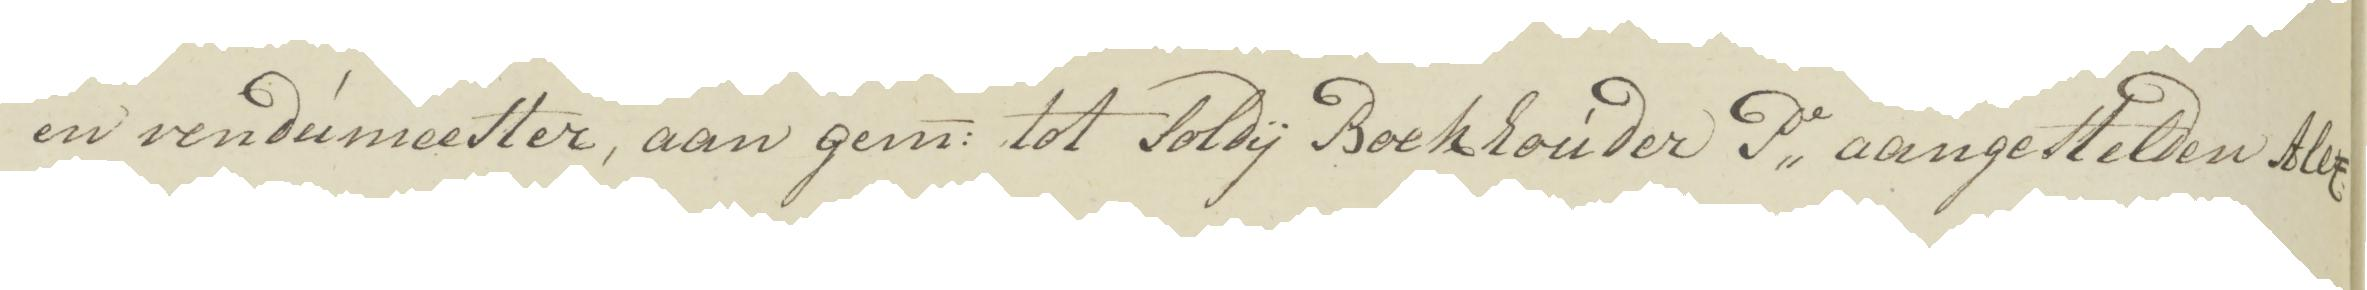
en vendumeester, aan gem: tot soldij Boekhouder P„e aangestelden Ale=
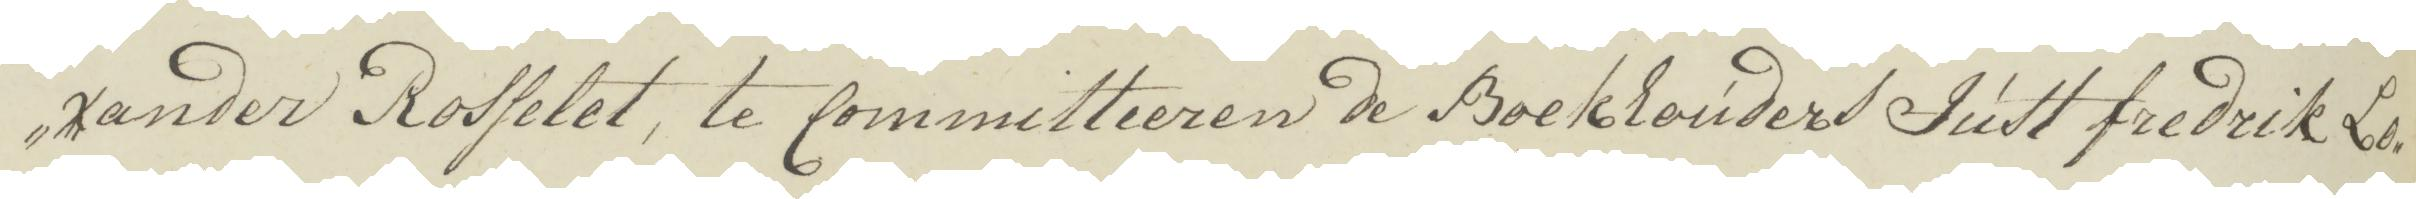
„xander Rosselet, te committeeren de Boekhouders Iust fredrik Lo„
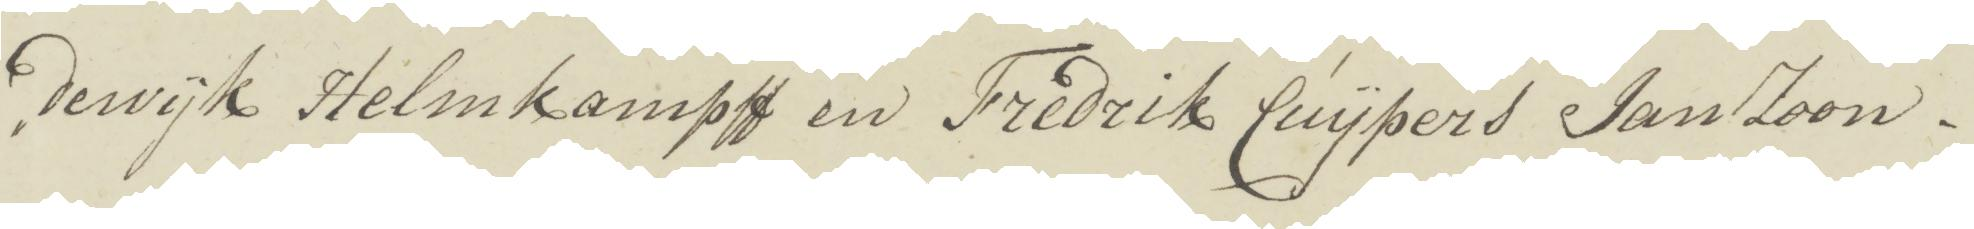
dewijk Helmkampff en Fredrik Cuijpers Ian Zoon.
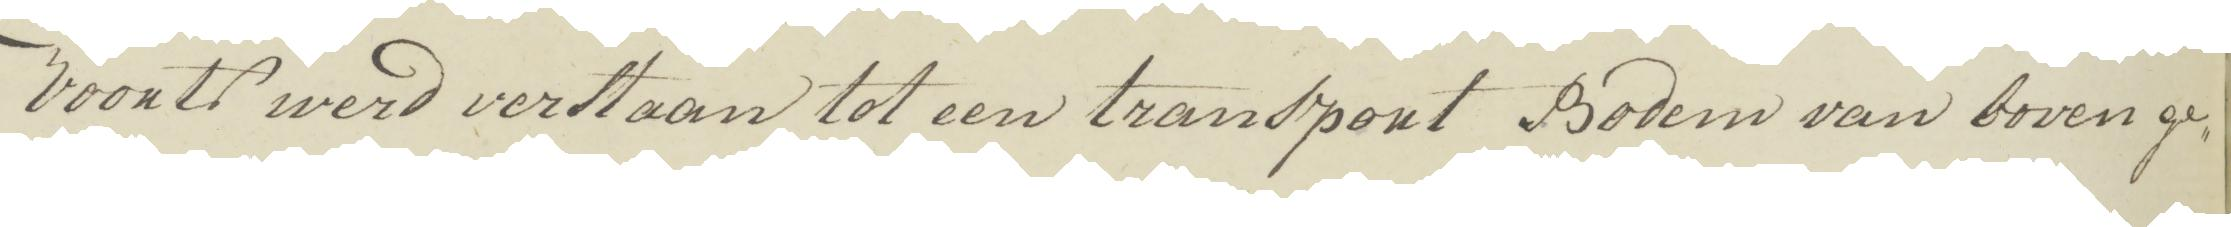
Voorts werd verstaan tot een transport Bodem van boven ge„
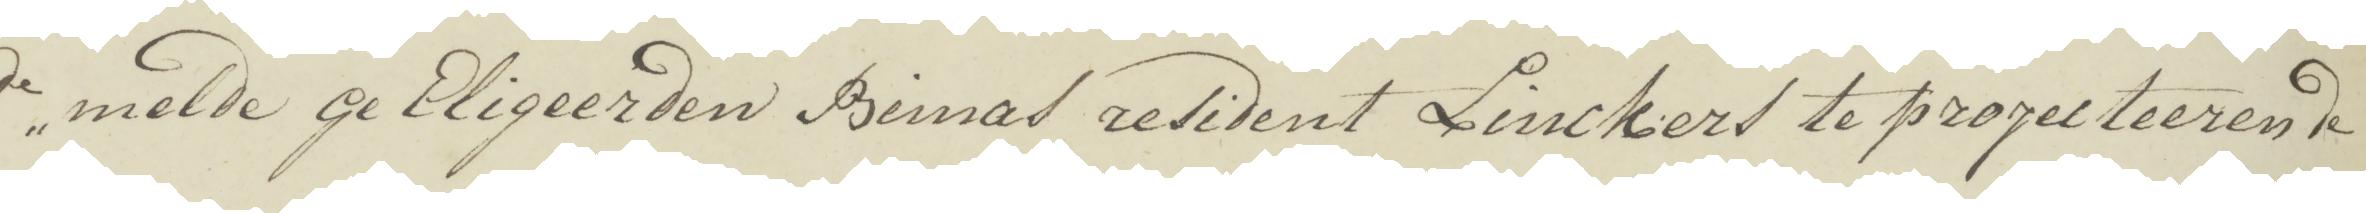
„melde ge Eligeerden Beinas resident Linckers te projecteeren de
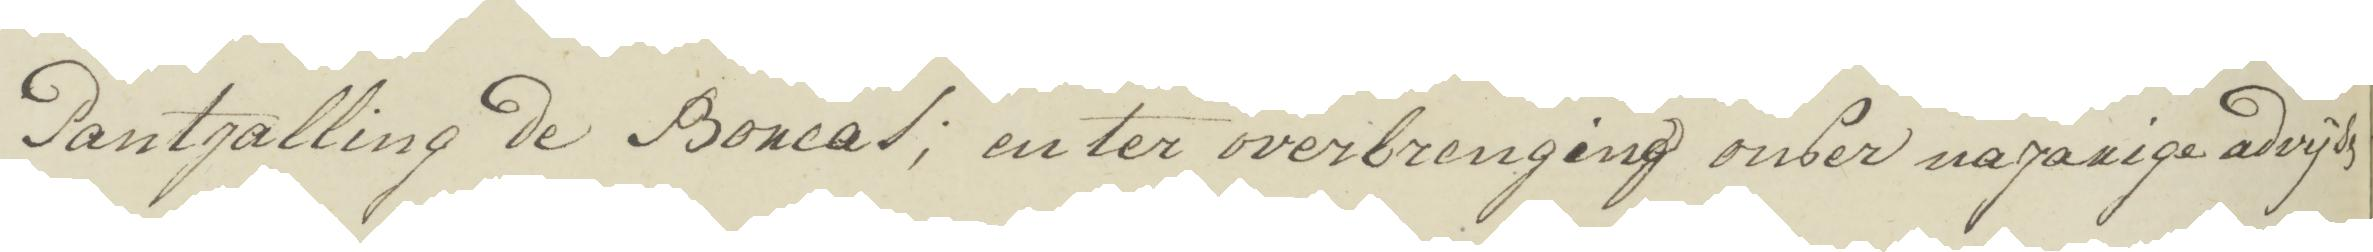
Pantjalling de Borcas; en ter overbrenging onser najarige advijsen
